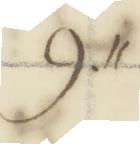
9. „
